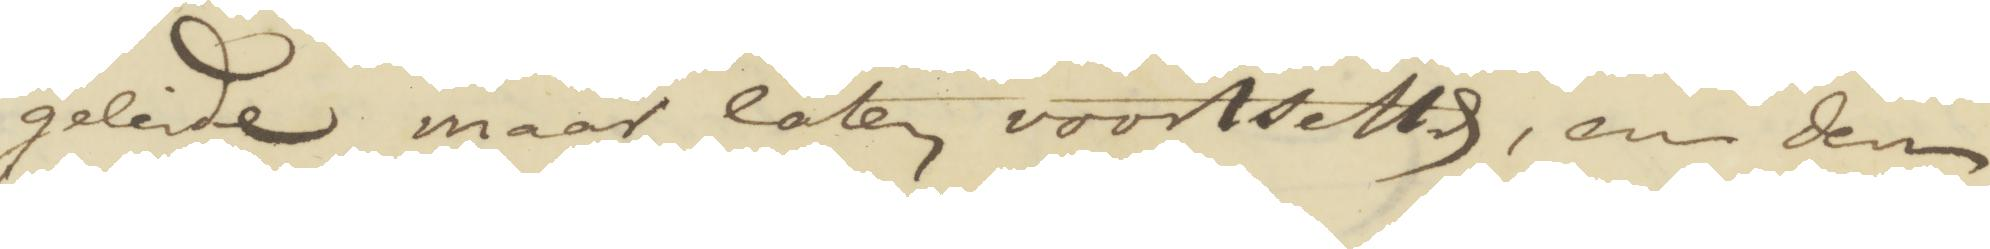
geleide maar laten voortsetten, en den
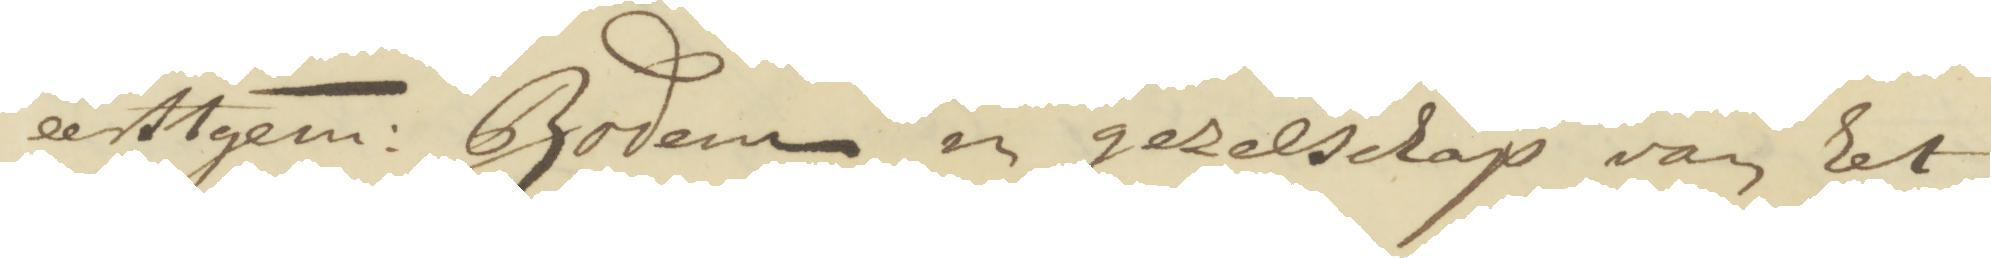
eerstgem: Bodem in gezelschap van het
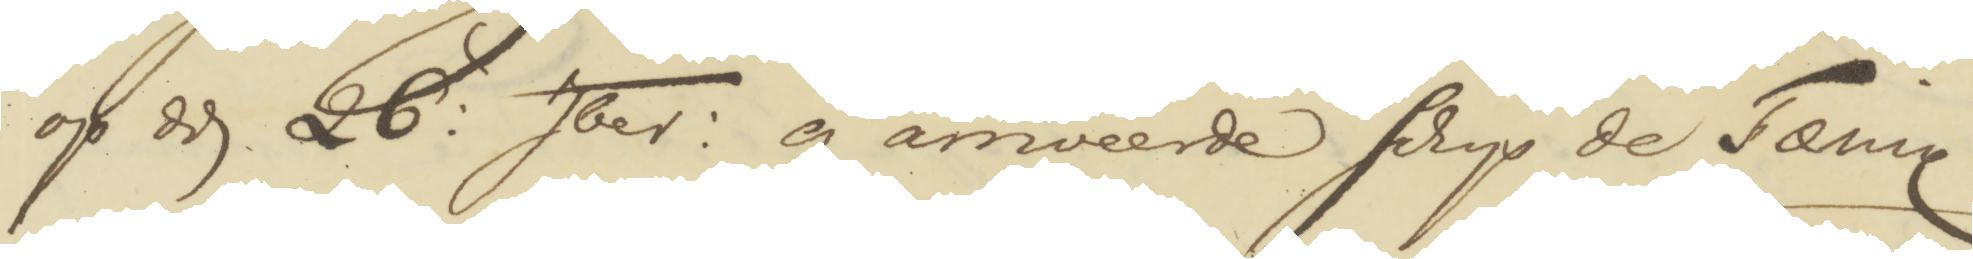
op den 26:' Jber: g'arriveerde schip de Faenix
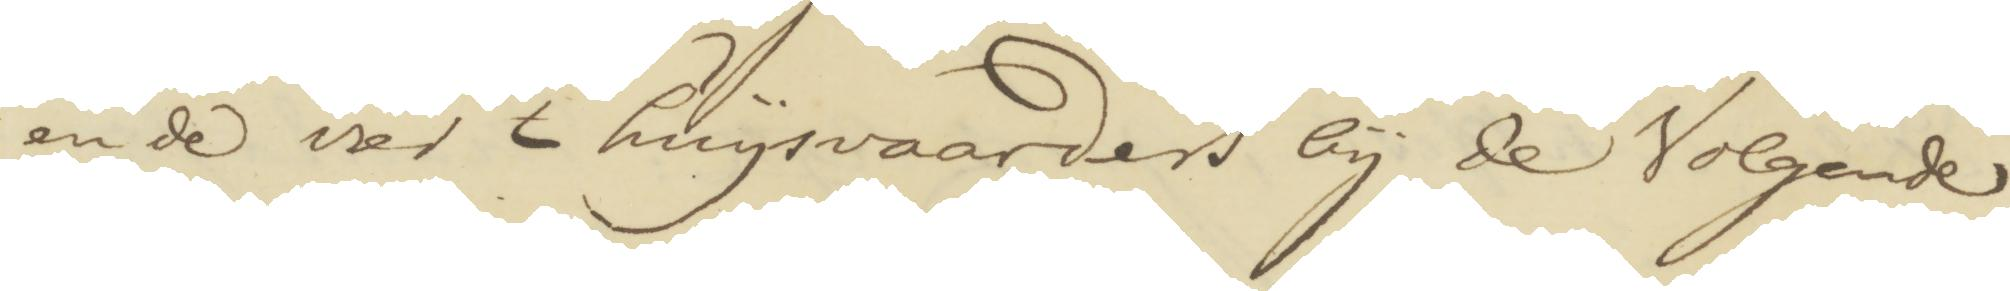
en de vier ’t huijsvaarders bij de Volgende
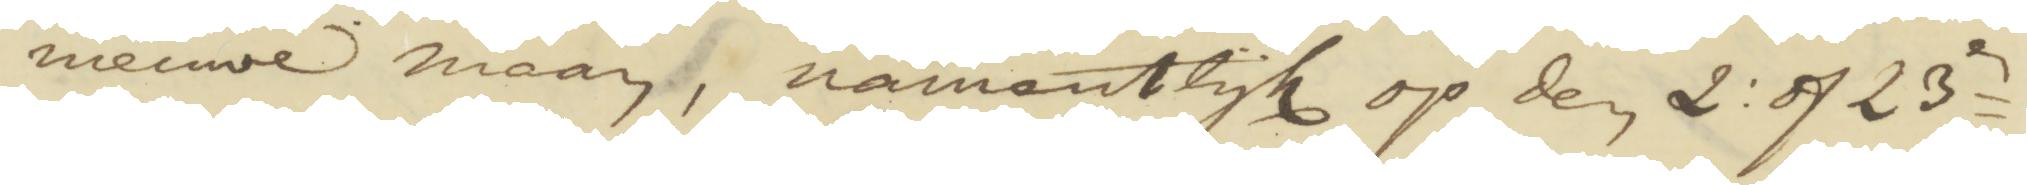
nieuwe maan, namentlijk op den 2: of 23=en
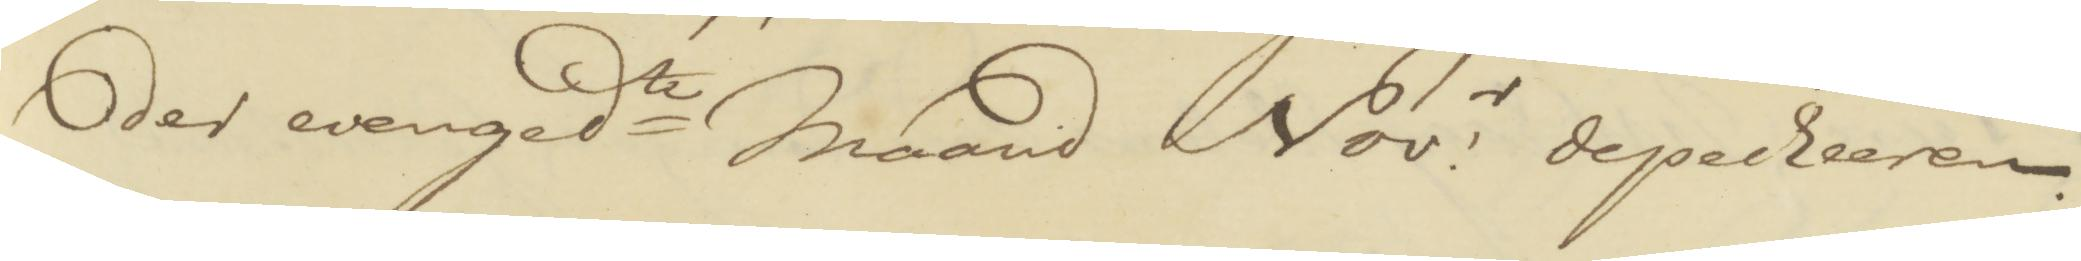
der evenged=te maand Nov:r depecheeren.
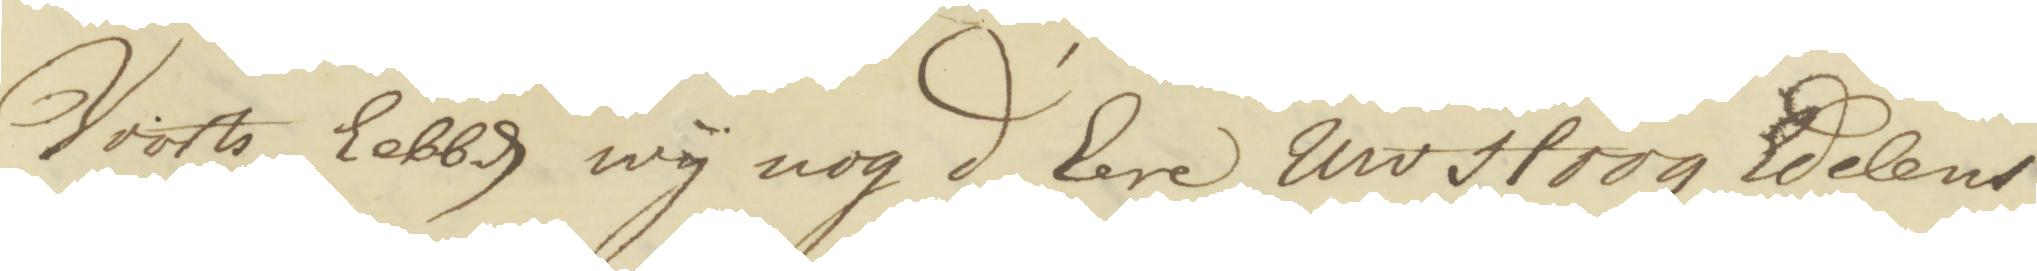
Voorts hebben wij nog d’ Eere uw Hoog Edelens
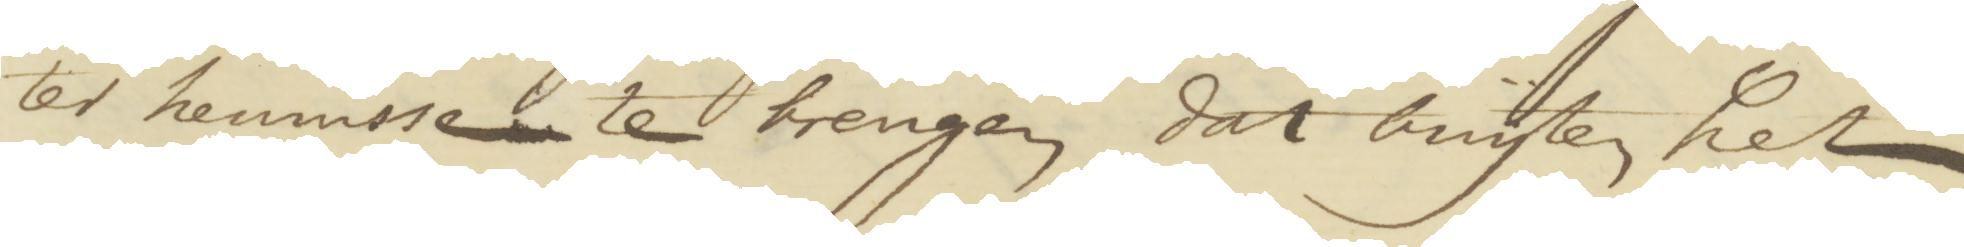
ter kennisse te brengen dat buijten het
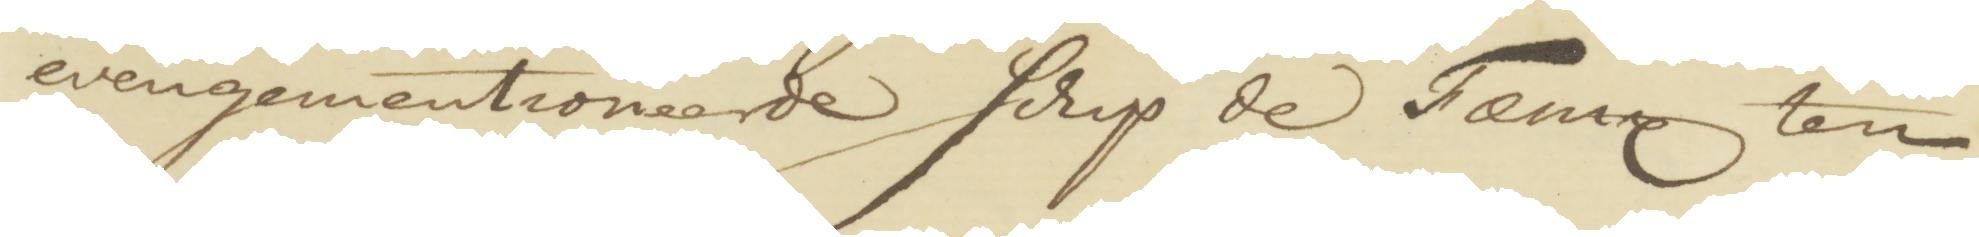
evengementioneerde schip de Faenix ten
